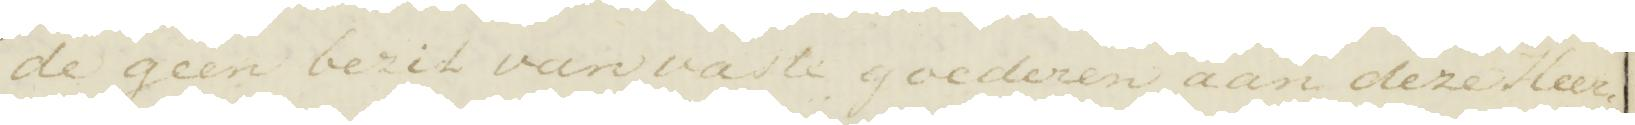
de geen bezit van vaste goederen aan deze Heer
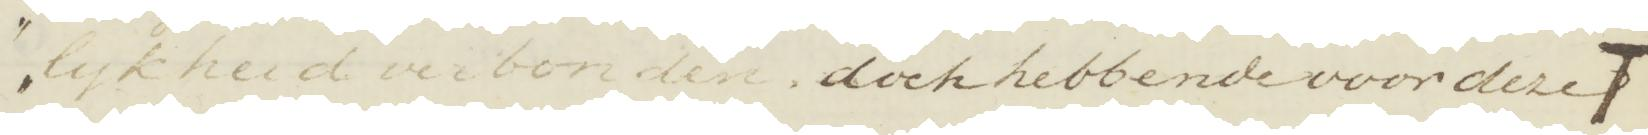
„lykheid verbonden, doch hebbende voor deze ¶
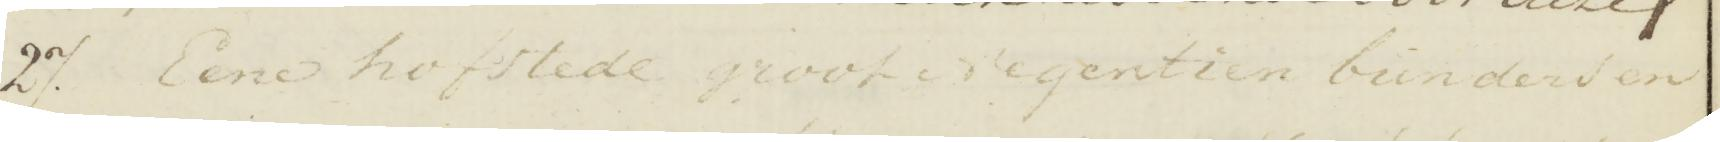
27. Eene hofstede groot Negentien bunders en
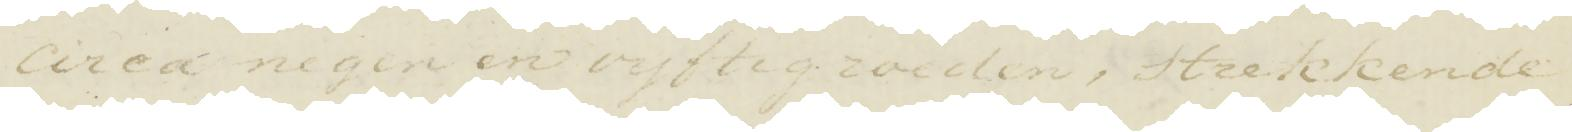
circa negen en vyftig roeden, strekkende
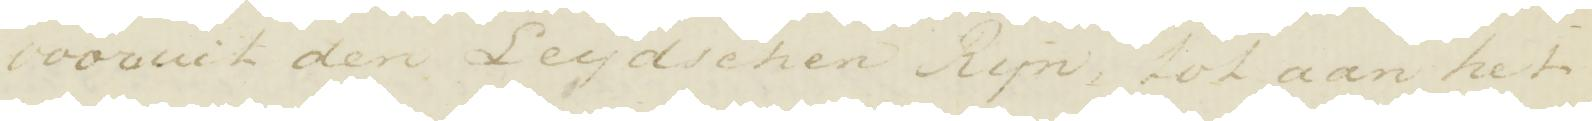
vooruit den Leydschen Ryn, tot aan het
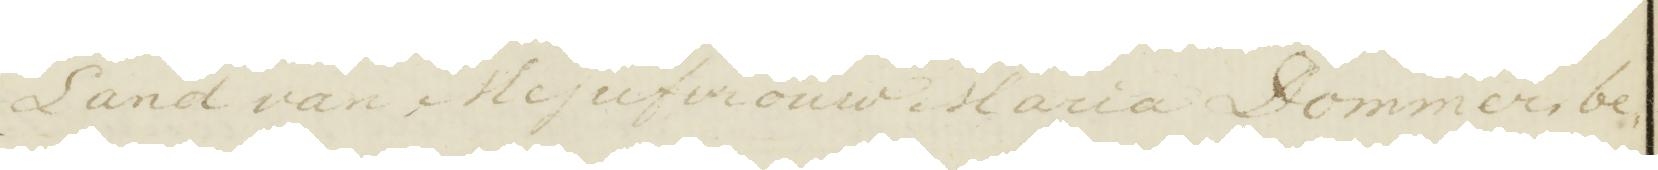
Land van Mejufvrouw Maria Dommer be,
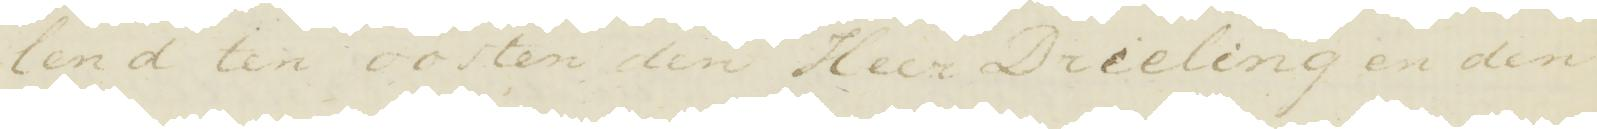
lend ten oosten den Heer Drieling en den
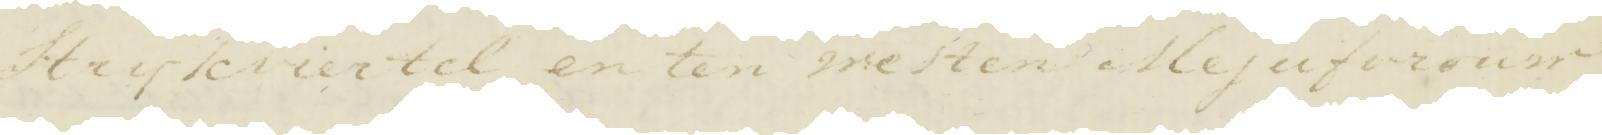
Strykviertel en ten westen Mejufvrouw
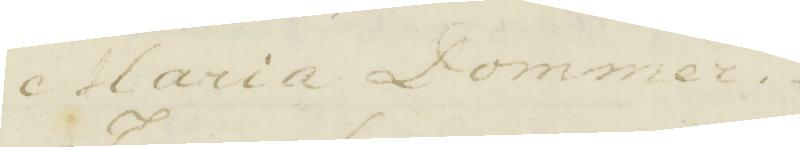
Maria Dommer.
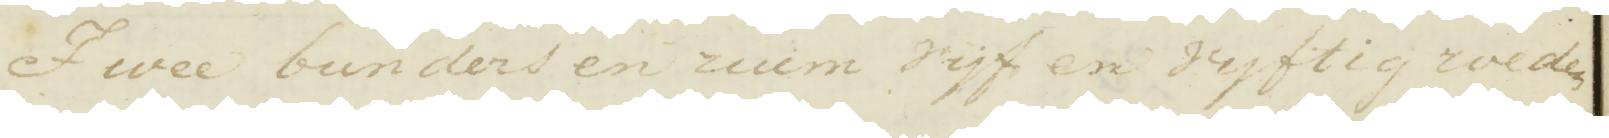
Twee bunders en ruim vijf en vyftig roeden
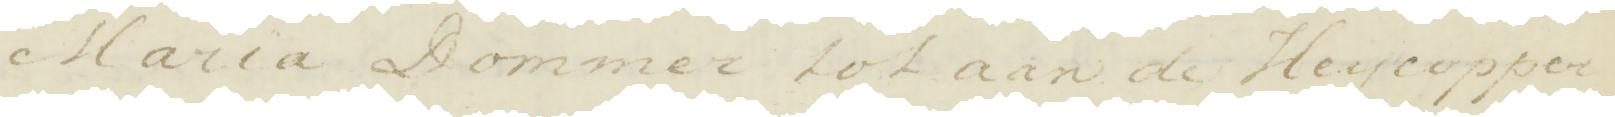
Maria Dommer tot aan de Heycopper
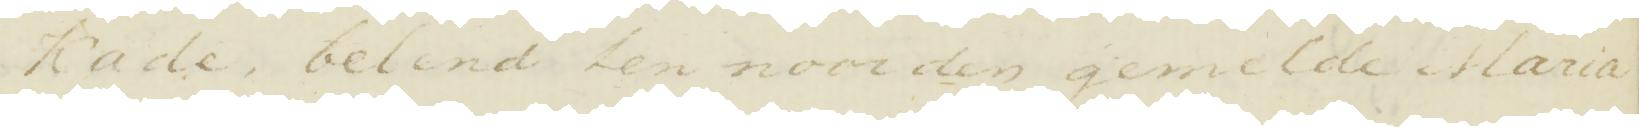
Kade, belend ten noorden gemelde Maria
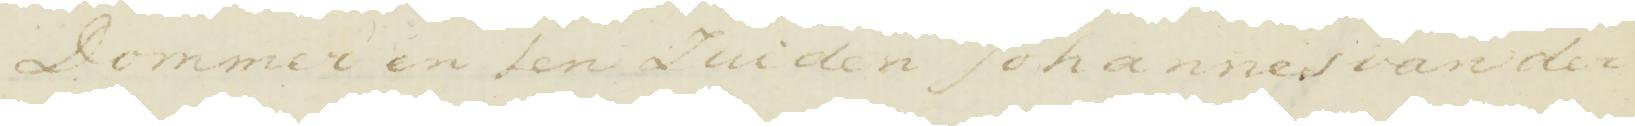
Dommer en ten Zuiden Johannes van der
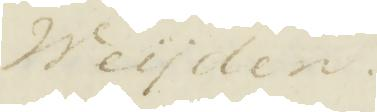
Weijden
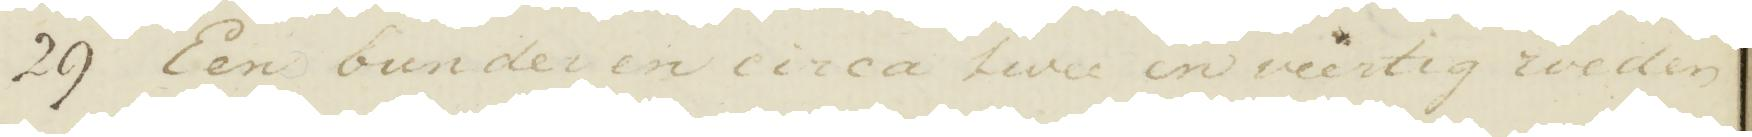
29 Een bunder en circa twee en veertig roeden
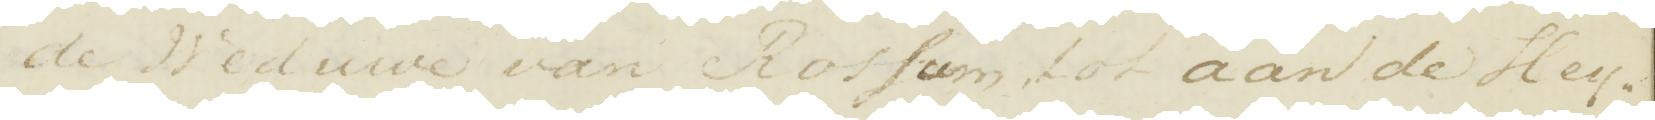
de Weduwe van Rossum, tot aan de Hey„
